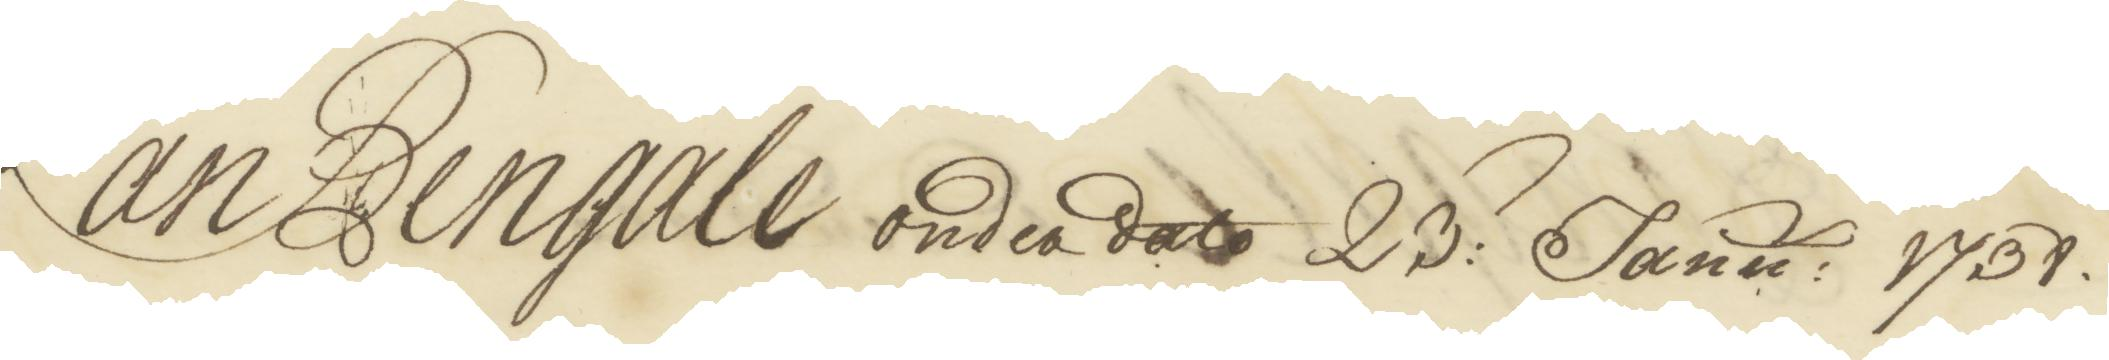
Van Bengale onder dato 23:' Janu: 1738.
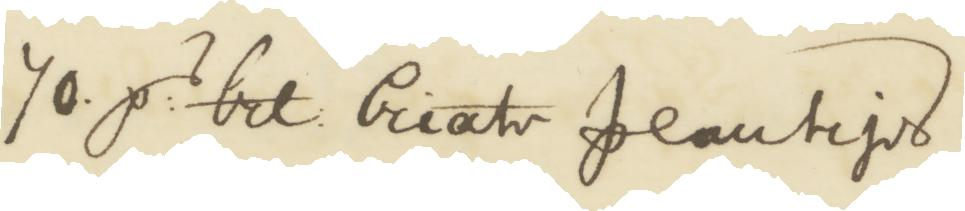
70. p:s kl: kiate plankjes
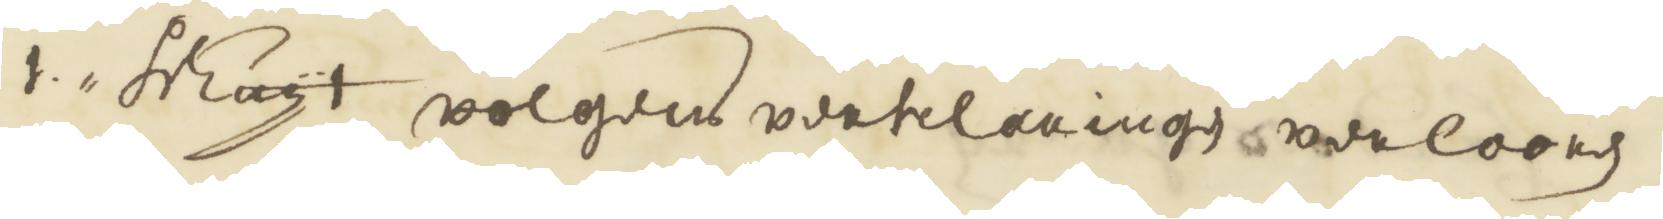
1. „ schuijt volgens verklaringen verlooren
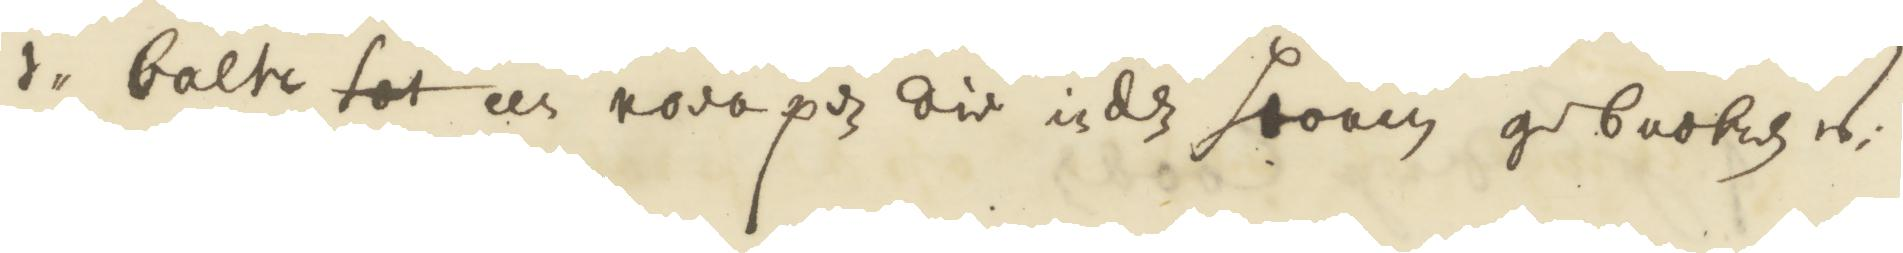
1„ balk tot een roeopen die in den storm gebroken is.
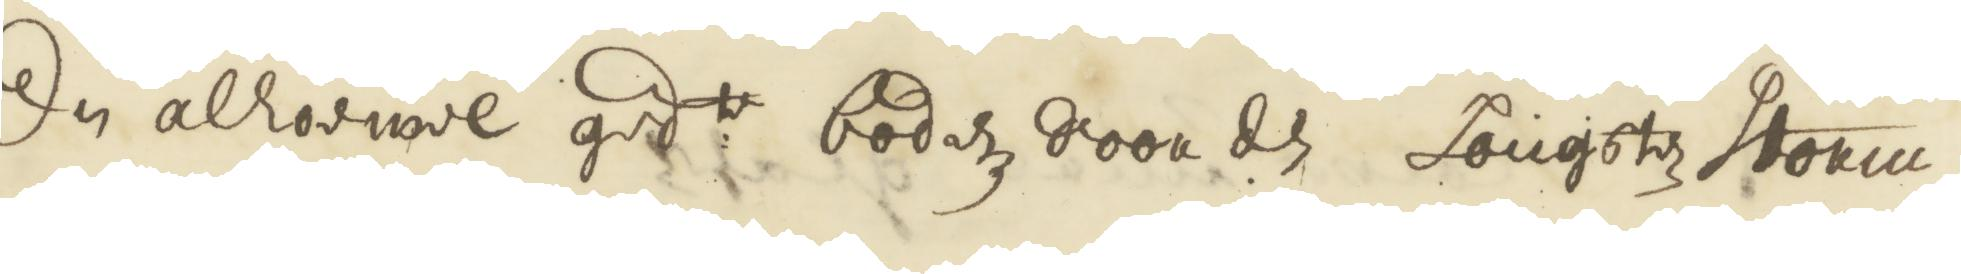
En alhoewel ged:te boden door den Iongsten storm
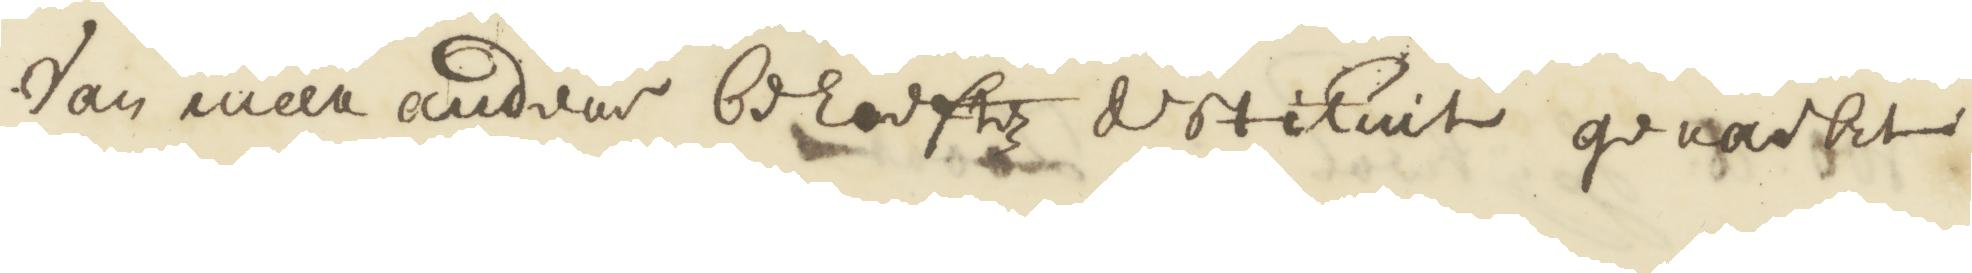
van meer andere behoeften destituit geraekt
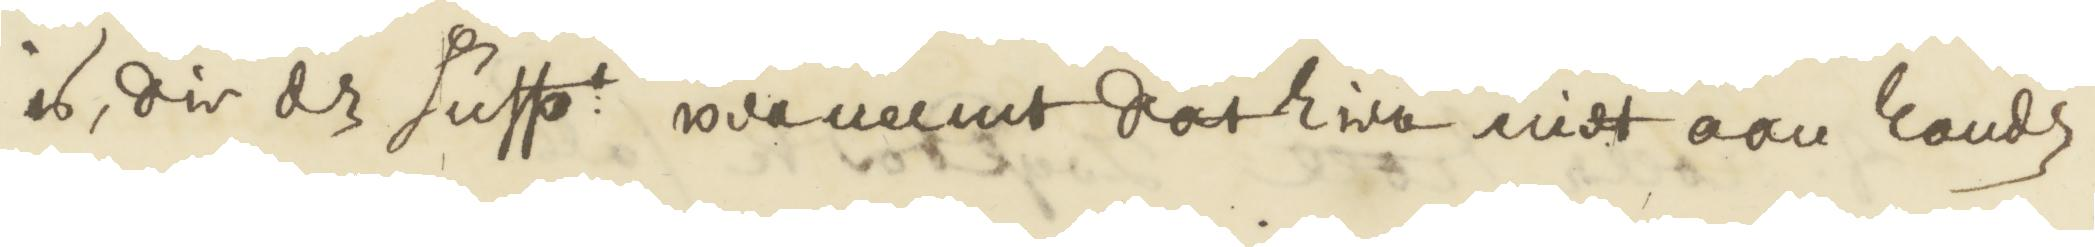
is, die den supp:t verneemt dat hier niet aan houden
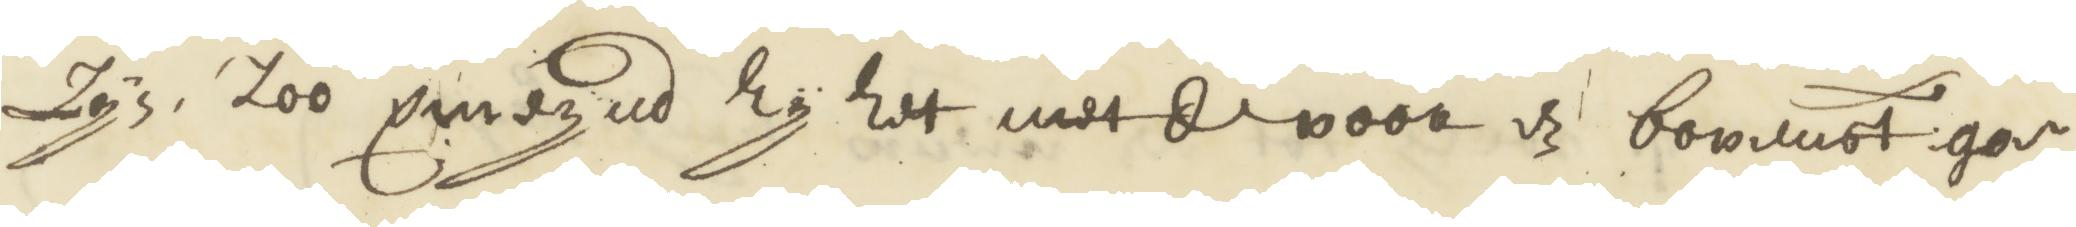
zijn, zoo pin eijnd hij het met de voor en bovenst: goe
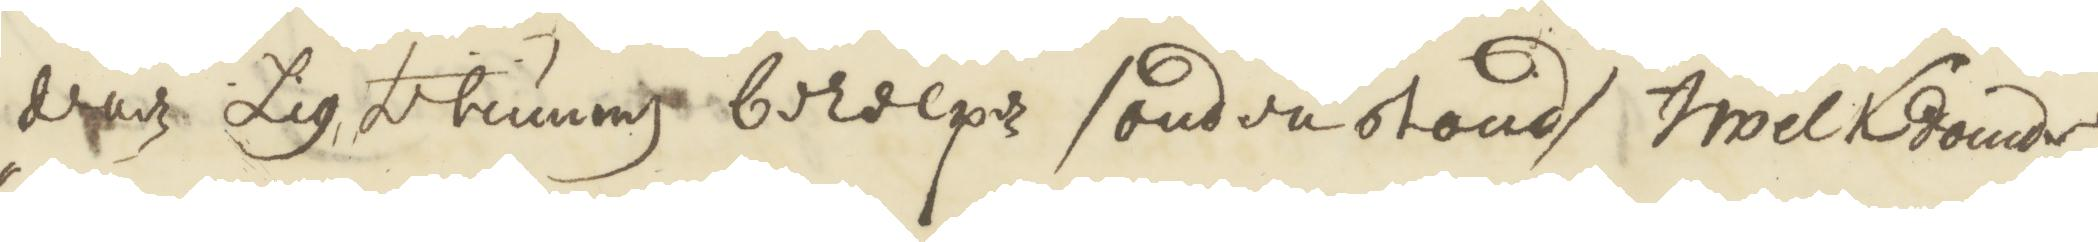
deren zig te kunnen behelpen /onderstond/ 'twelk doende
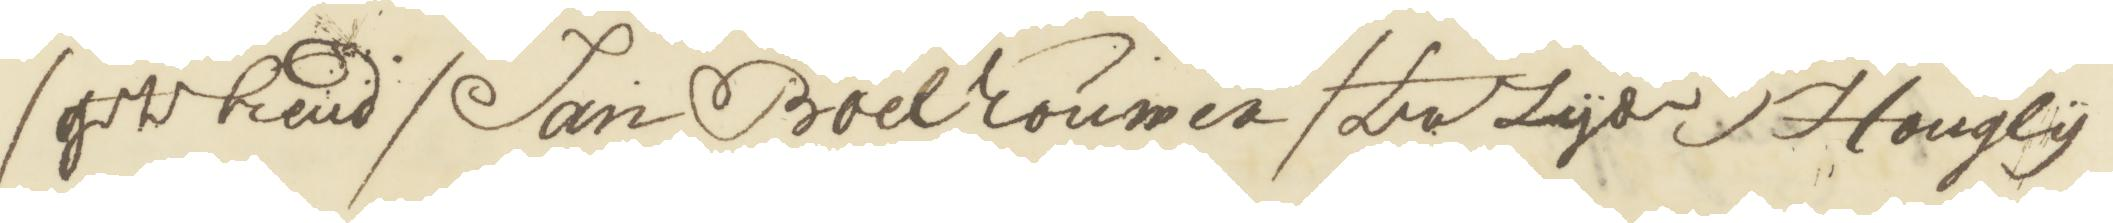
/getekend / Jan Boelhouwer /ter zijde/ Houglij
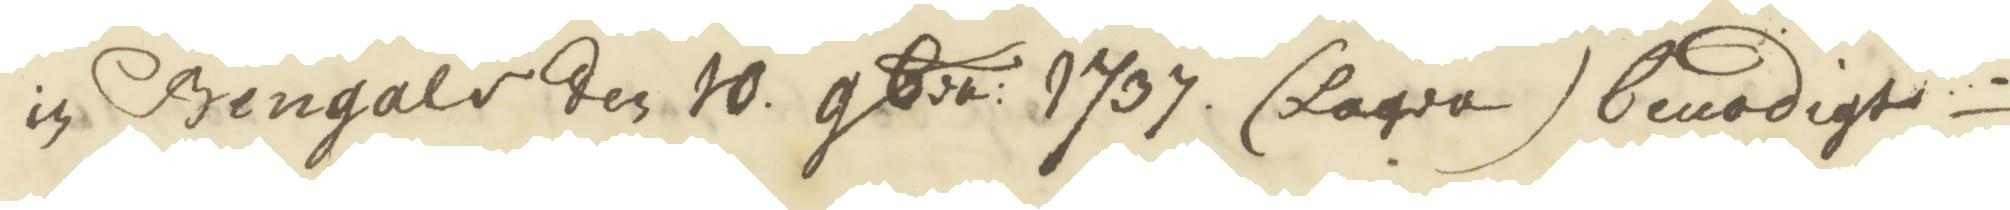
in Bengale den 10. 9ber: 1737. (Lager) benodigt
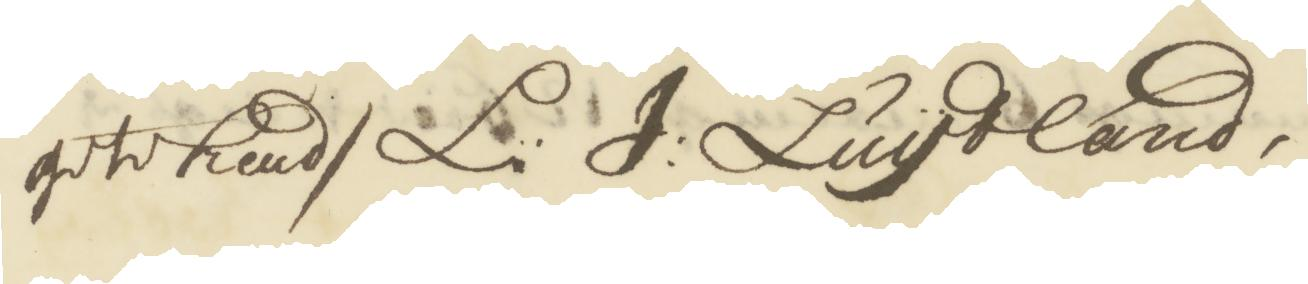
getekend/ L: I: Zuijtland,
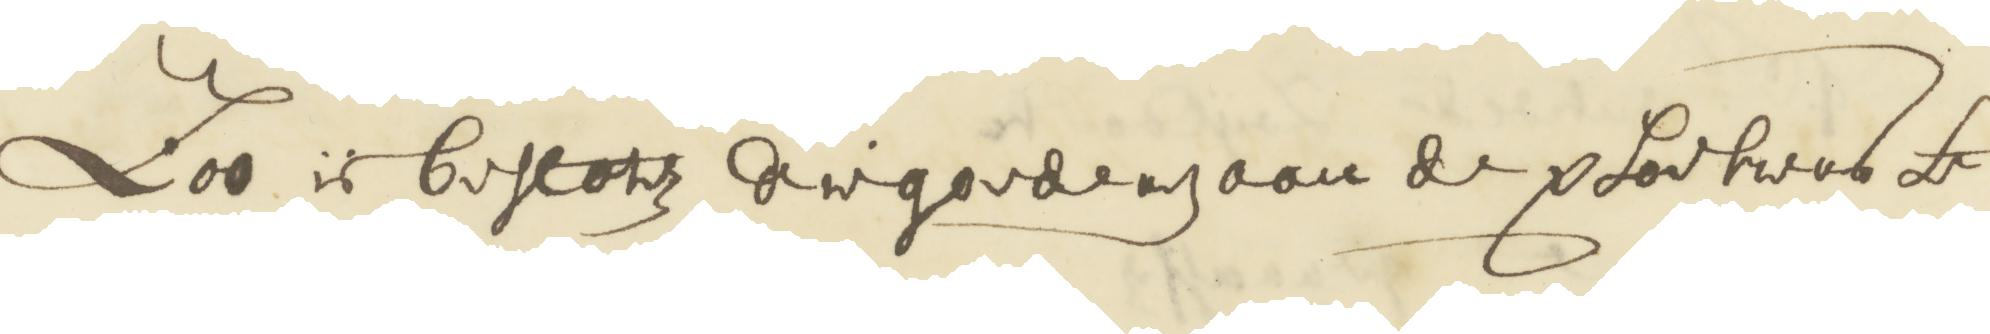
Zoo is besloten die goederen aan de versoekers te
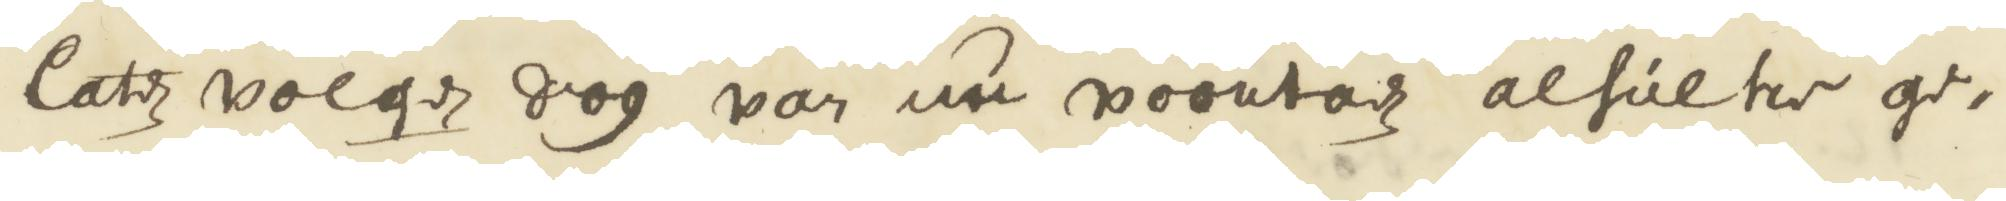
laten volgen dog van nu voortaen alsulke ge„
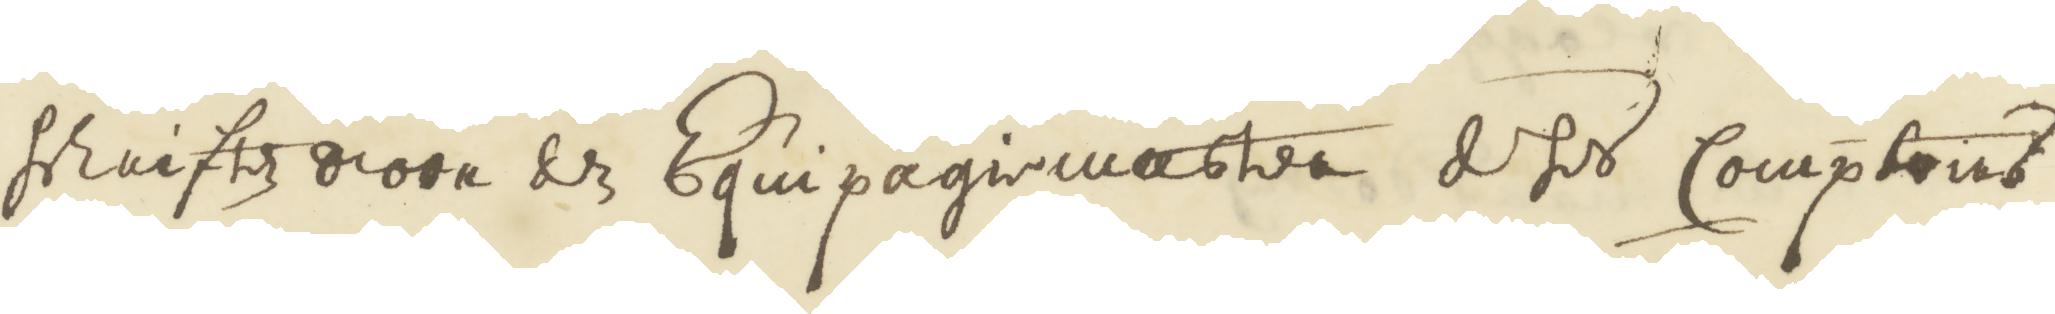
schriften door den Equipagiemeester deses Comptoirs
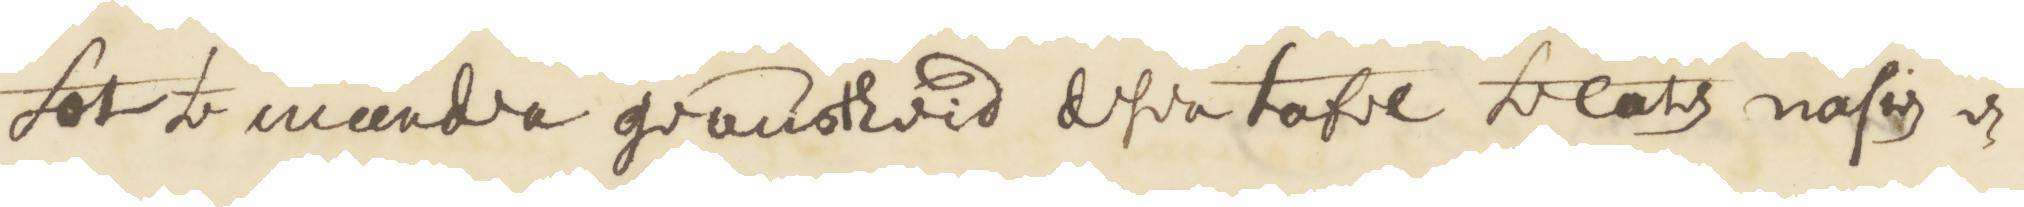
tot te meerder gerustheid deser tafel te laten nasien en
